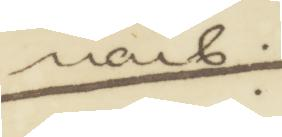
naib
